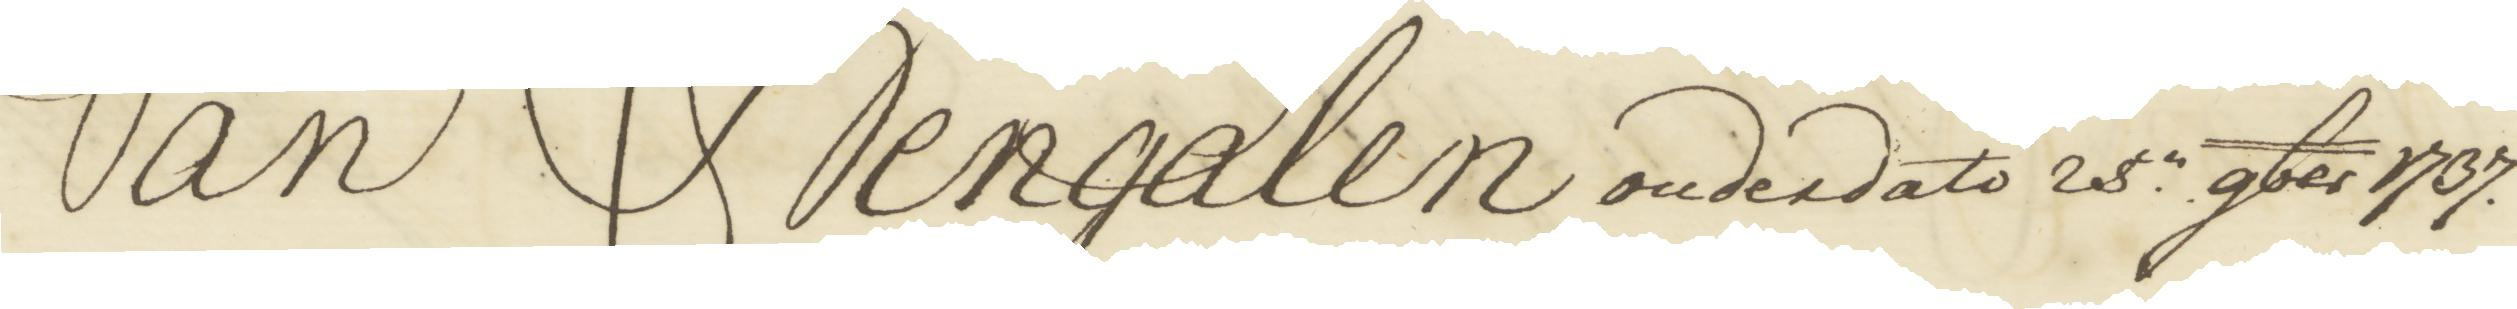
Van Bengalen onder dato 25:en 9ber 1737.
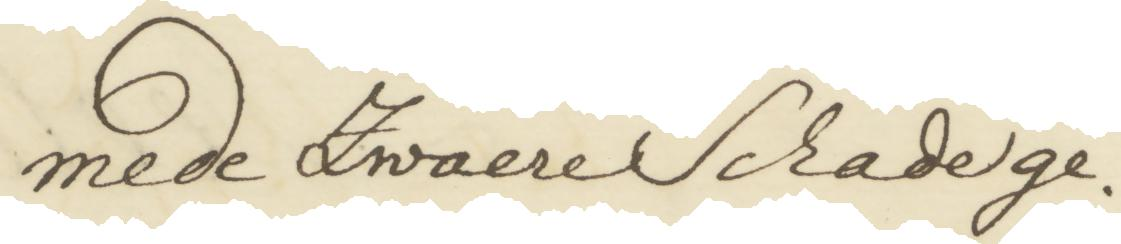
mede zwaere schade ge
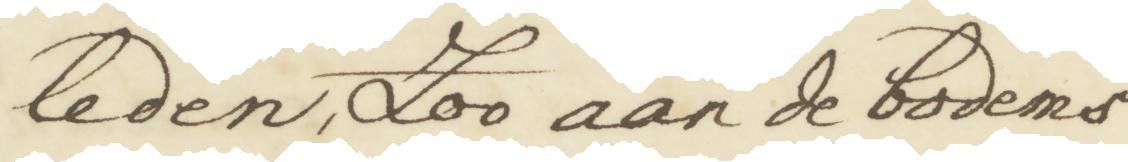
leden, zoo aan de bodems
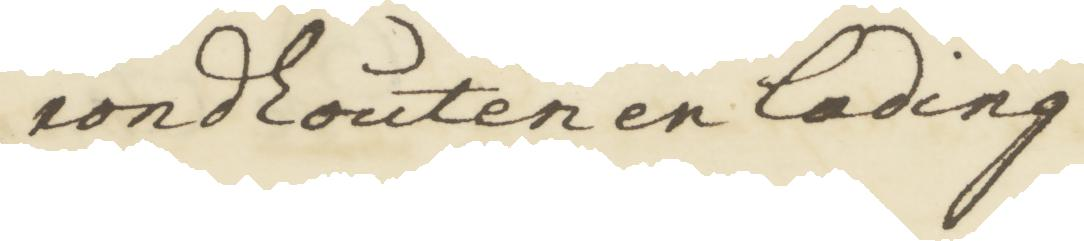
rondhouten en lading
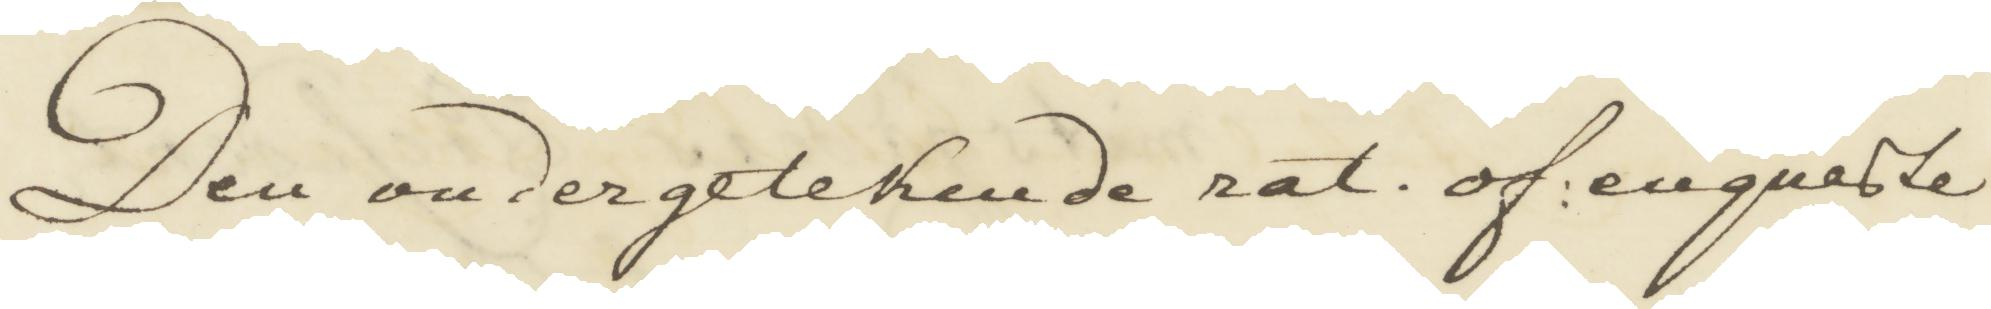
Den ondergetekende rat. of: enquaste
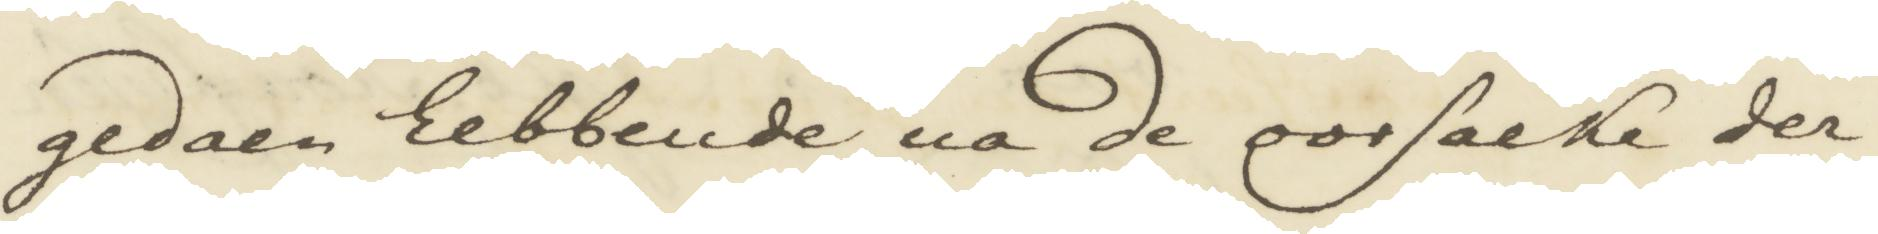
gedaen hebbende na de oorsaeke der
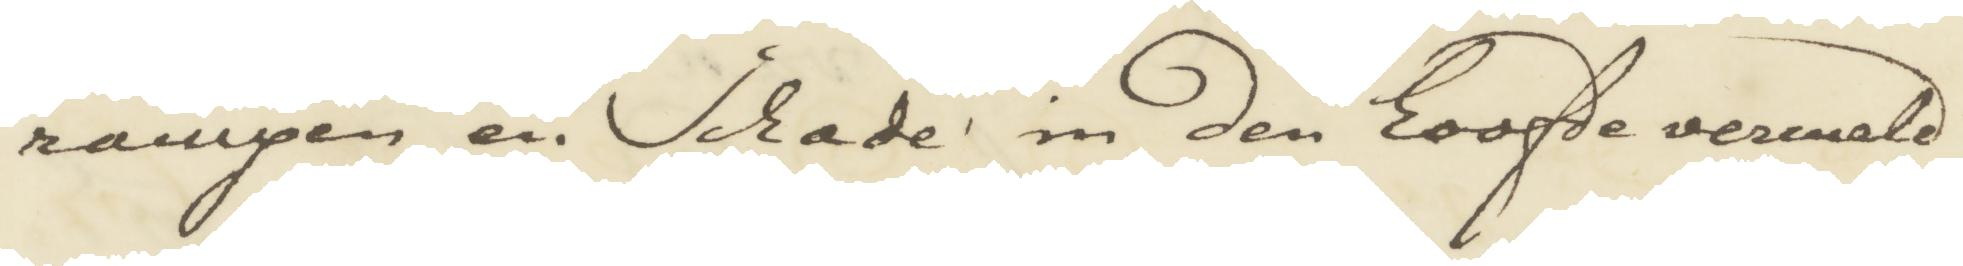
rampen en schade in den hoofde vermeld
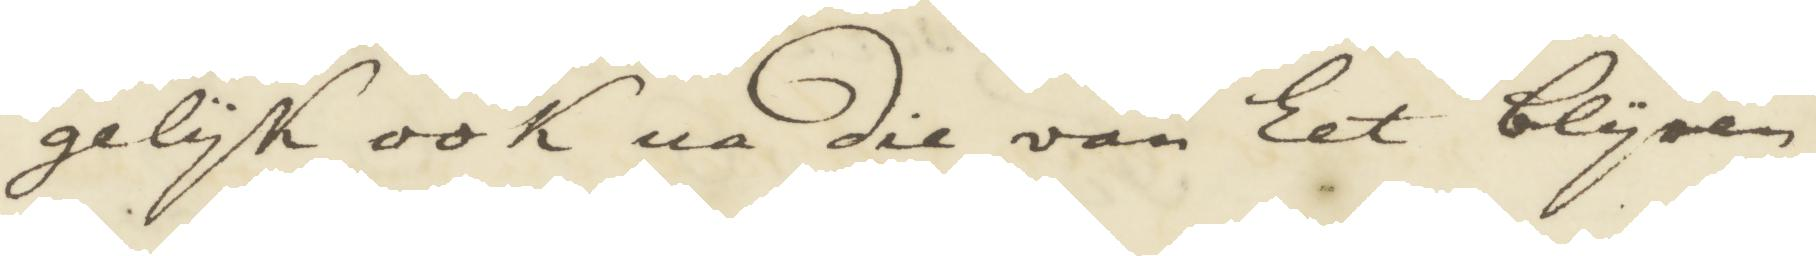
gelijk ook na die van het blijven
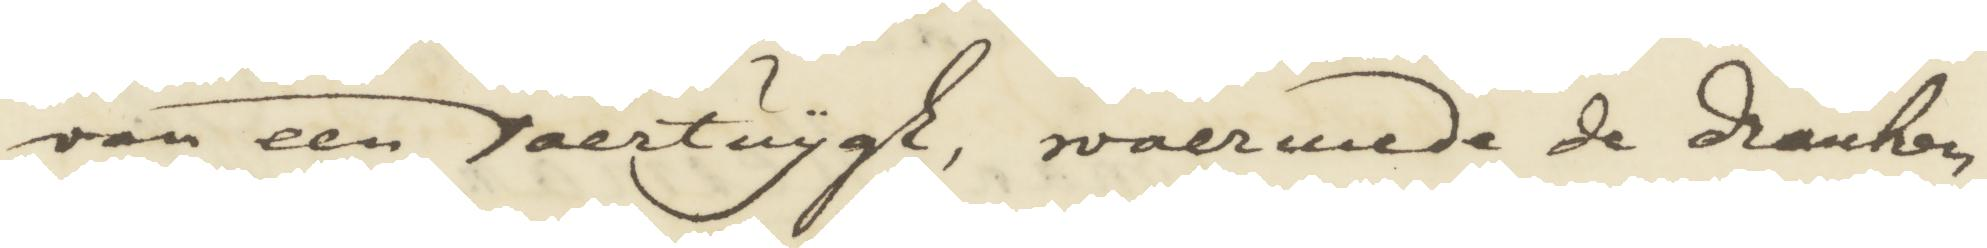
van een vaertuijgh, waermede de dranken
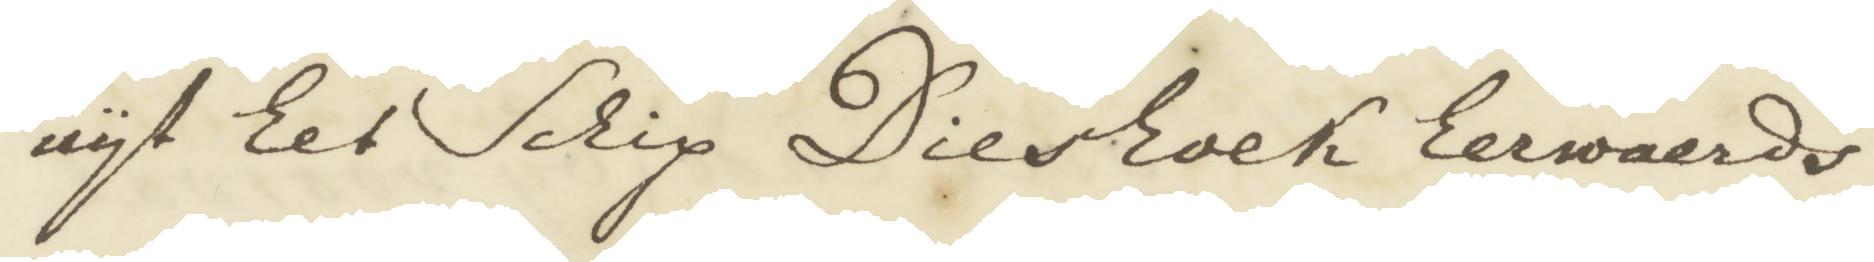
uijt het schip Dieshoek herwaerds
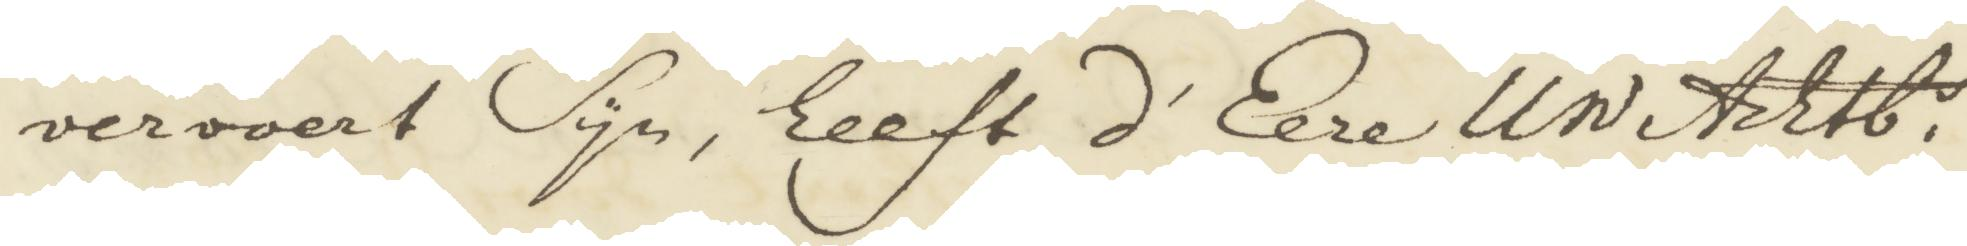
vervoert sijn, heeft d’ Eere uw Achtb,s
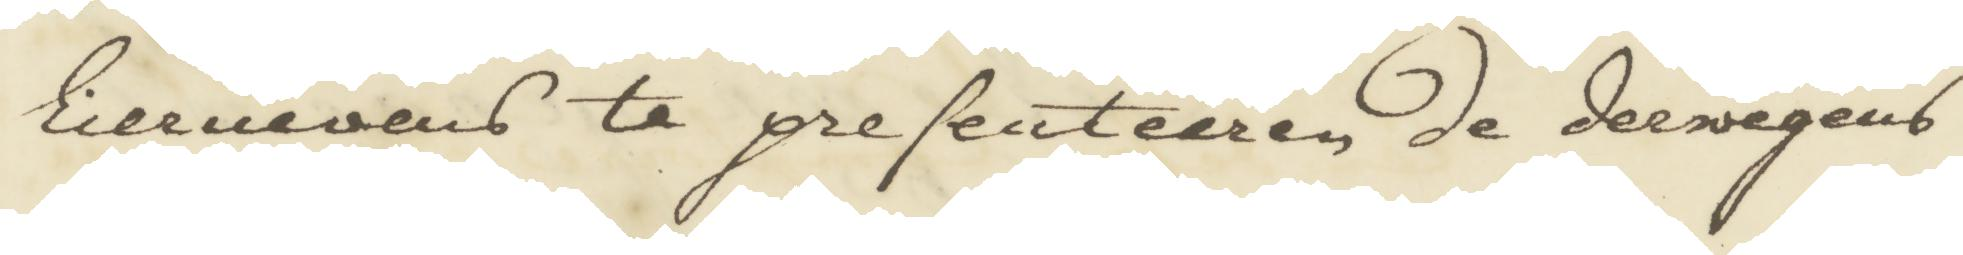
hiernevens te presenteeren de derwegens
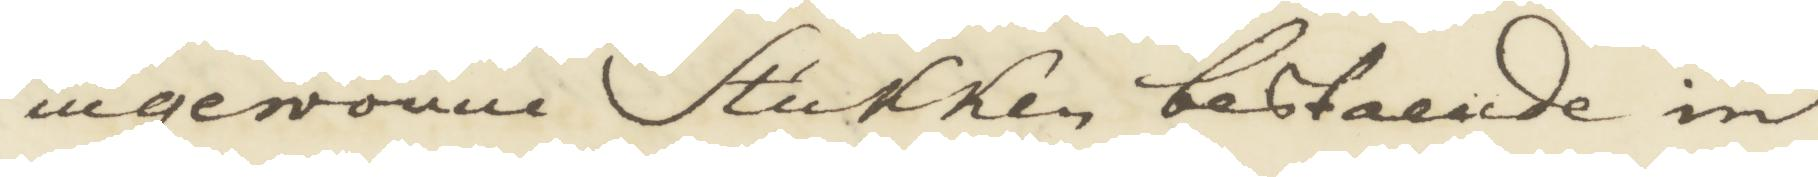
in gewonne stukken bestaende in
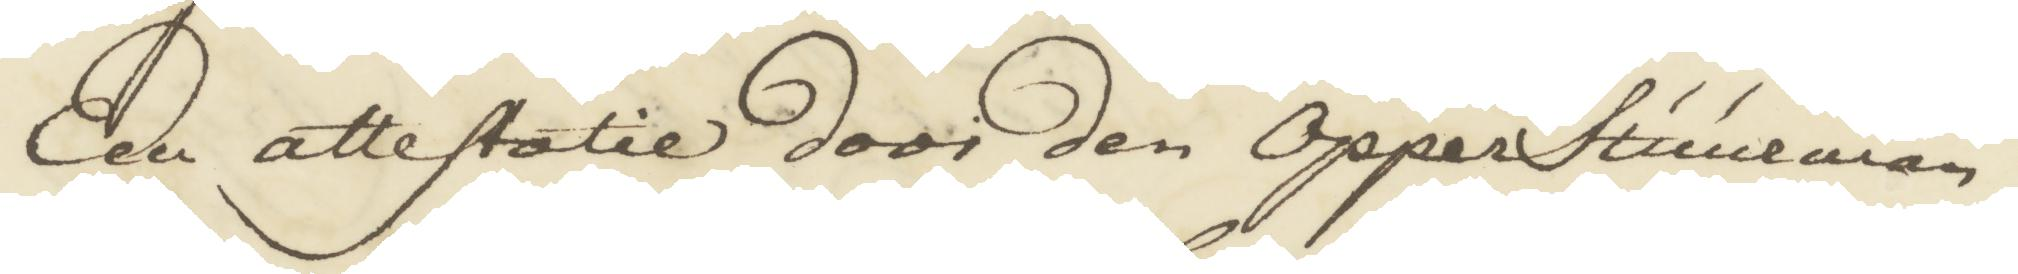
Een attestatie door den Opperstuurman
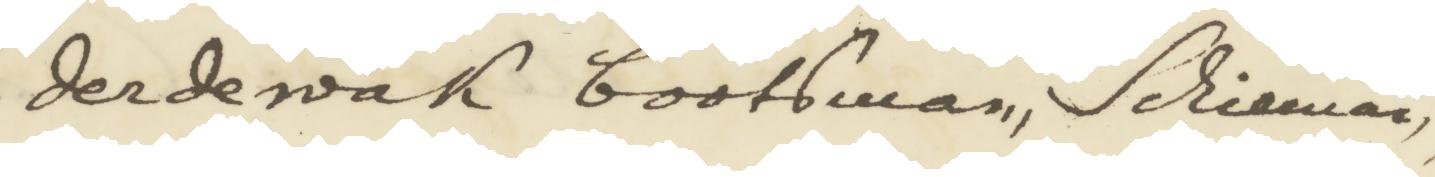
derdewák bootsman, schieman,
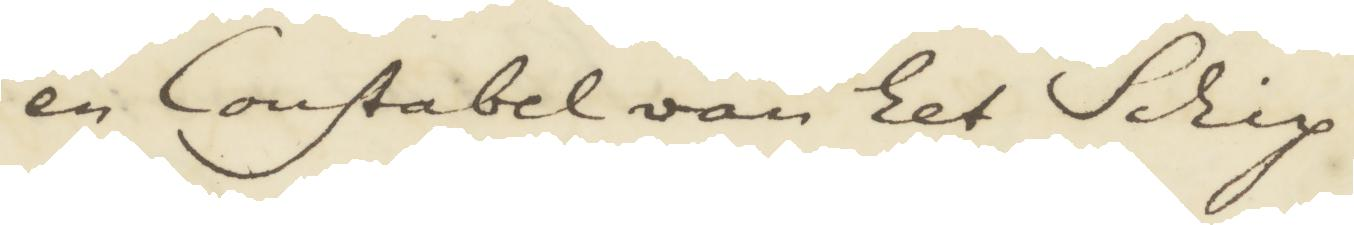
en Constabel van het schip
